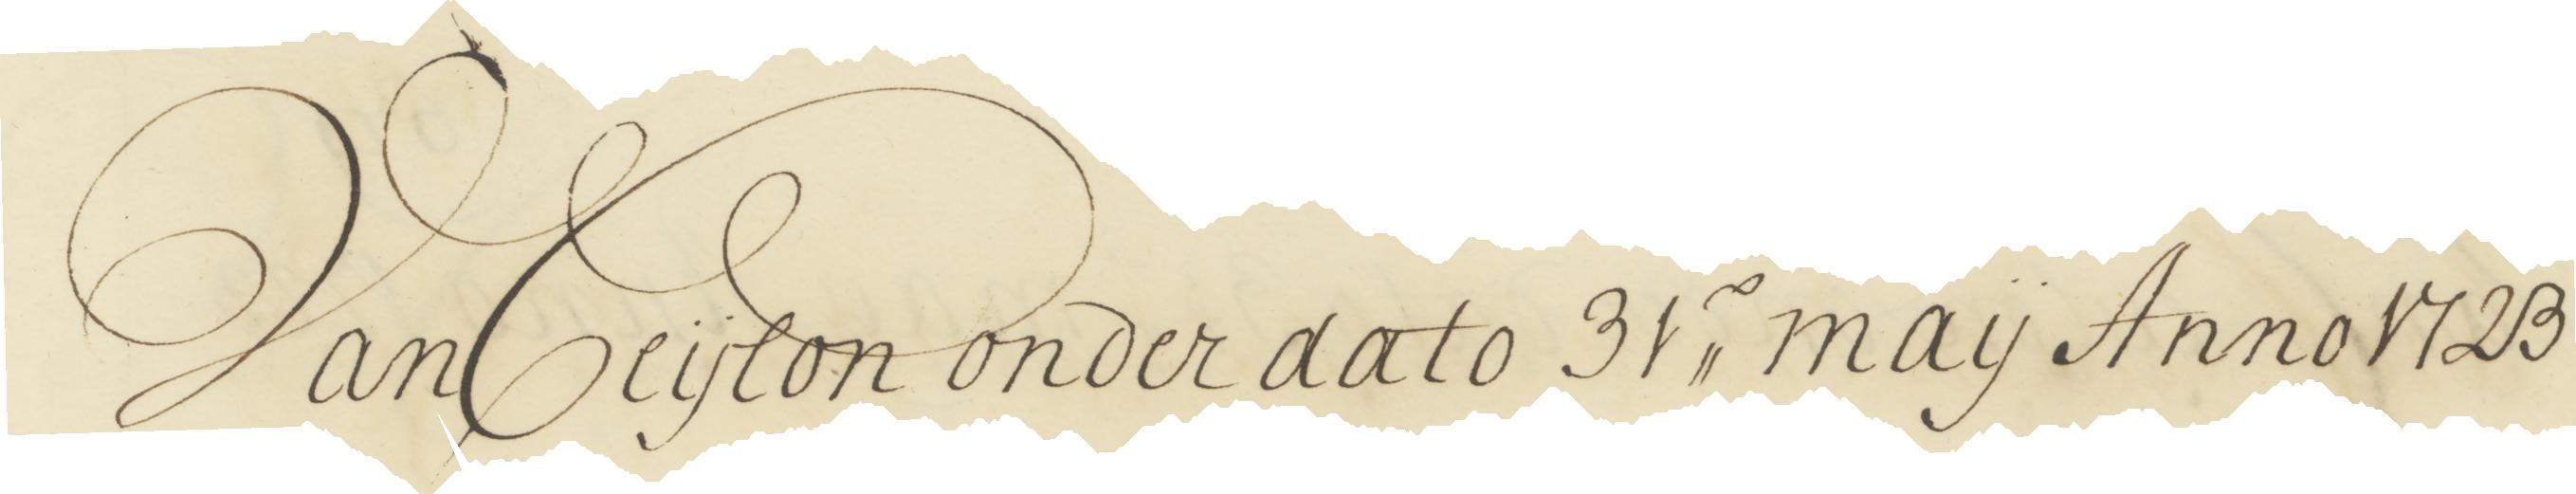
Van Ceijlon onder dato 31„' maij Anno 1723
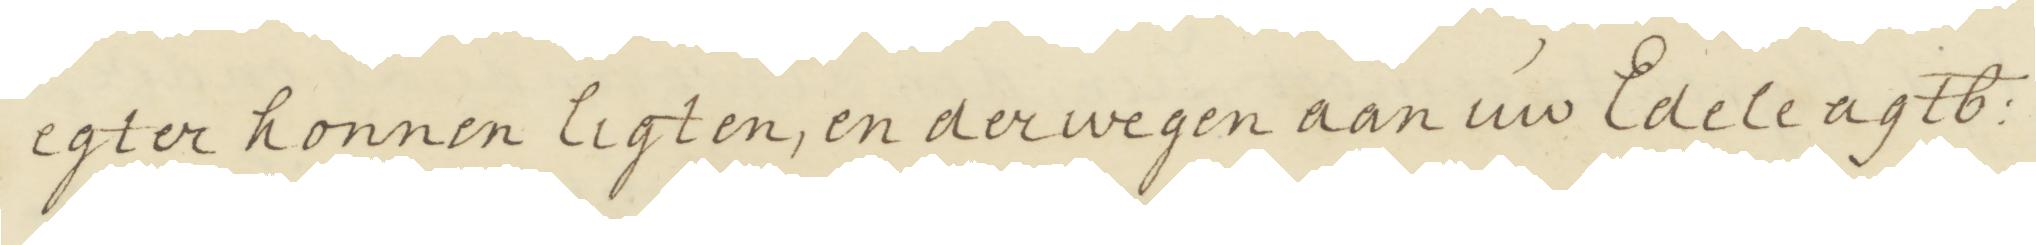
egter konnen ligten, en der wegen aan uw Edele agtb:
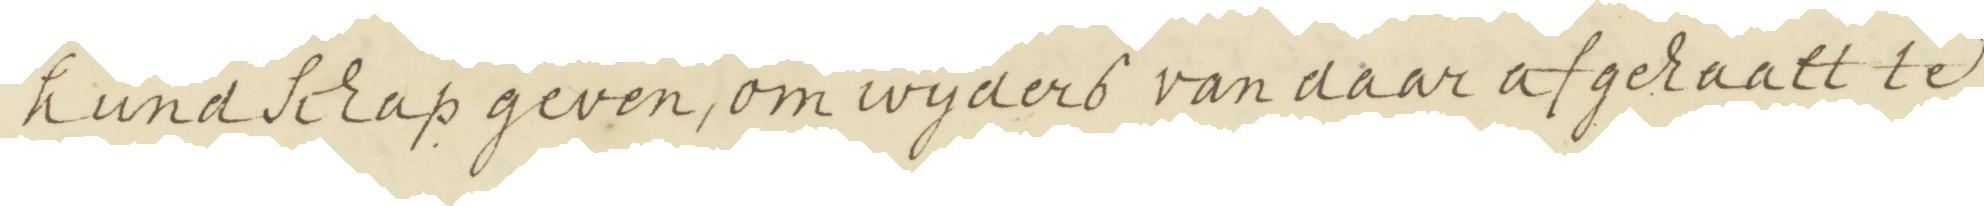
kundschap geven, om wijders van daar afgehaalt te
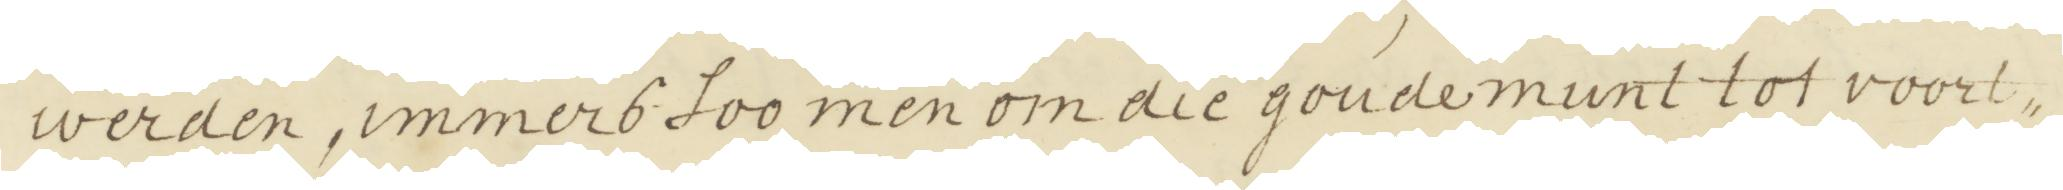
werden, immers soo men om die goude munt tot voort„
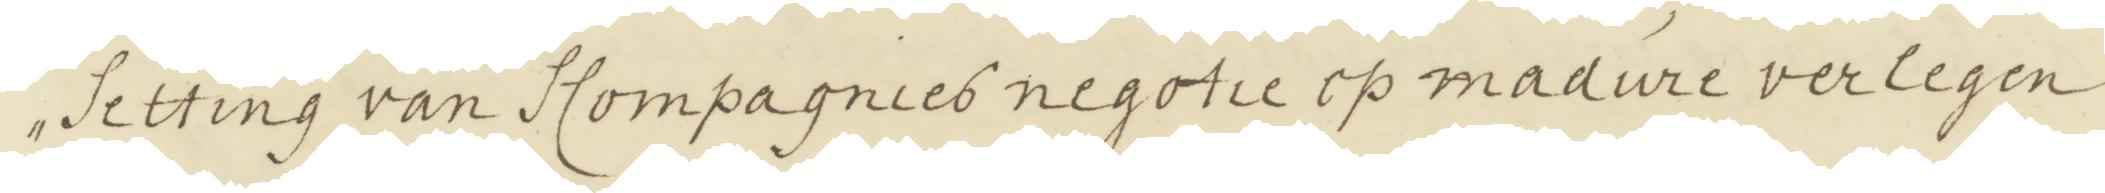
„setting van 's Compagnies negotie op madure verlegen
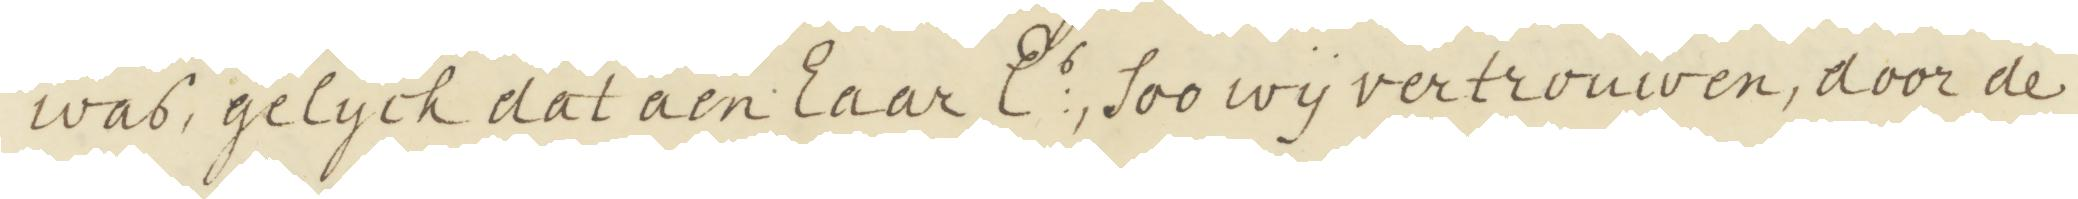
was, gelijck dat aen haar E:s, soo wij vertrouwen, door de
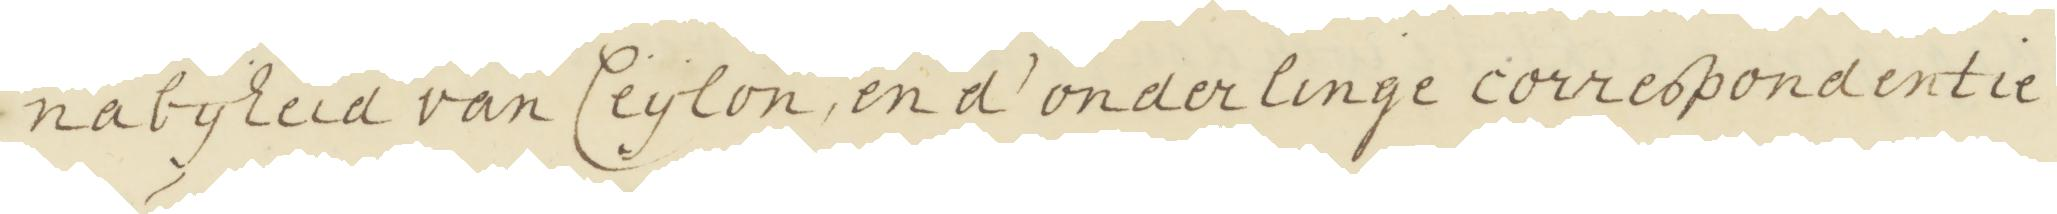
nabijheid van Ceijlon, en d’ onderlinge correspondentie
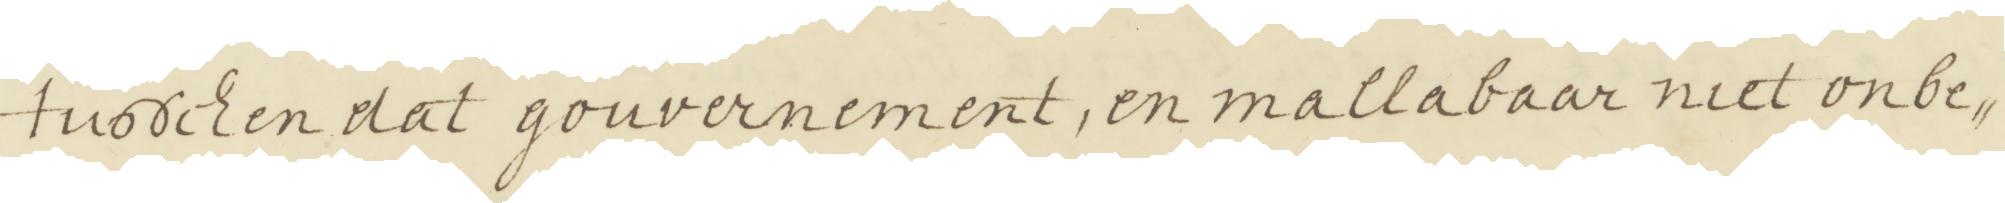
tusschen dat gouvernement, en mallabaar niet onbe„
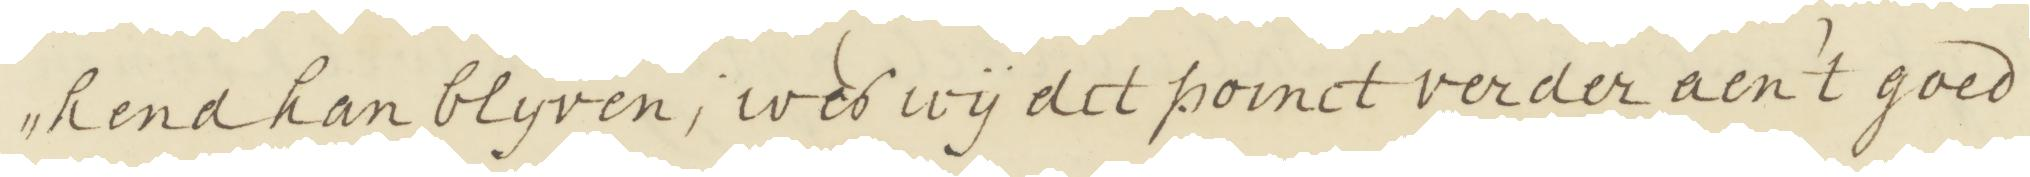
„kend kan blijven; wes wij dit poinct verder aen ’t goed
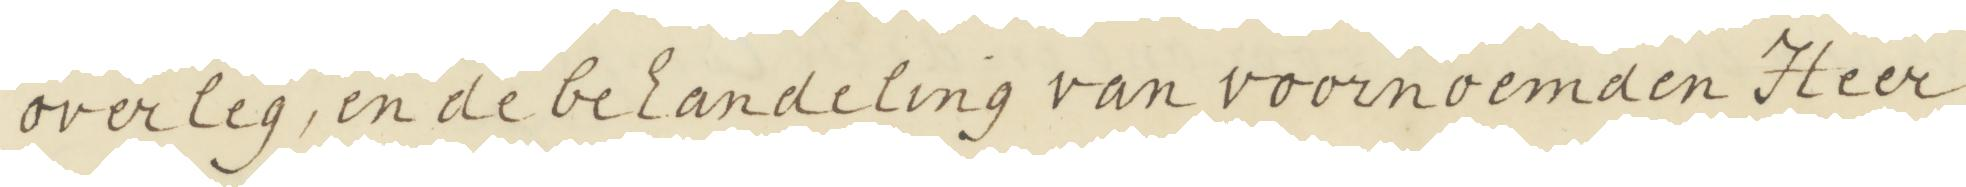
overleg, en de behandeling van voornoemden Heer
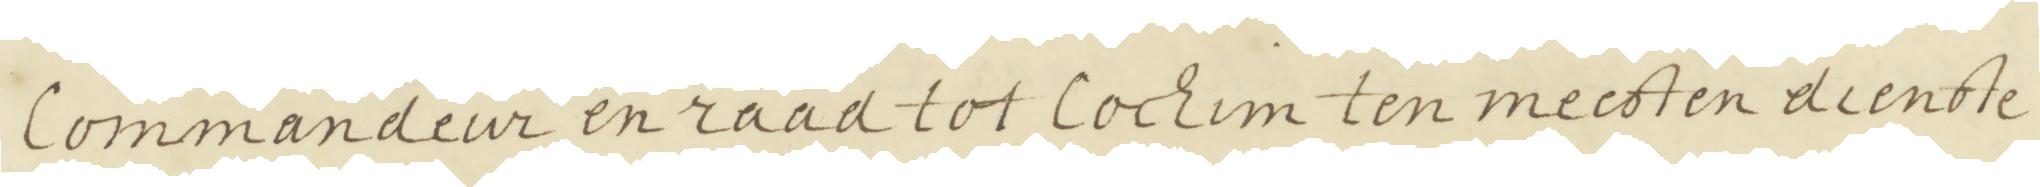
Commandeur en raad tot Cochim ten meesten dienste
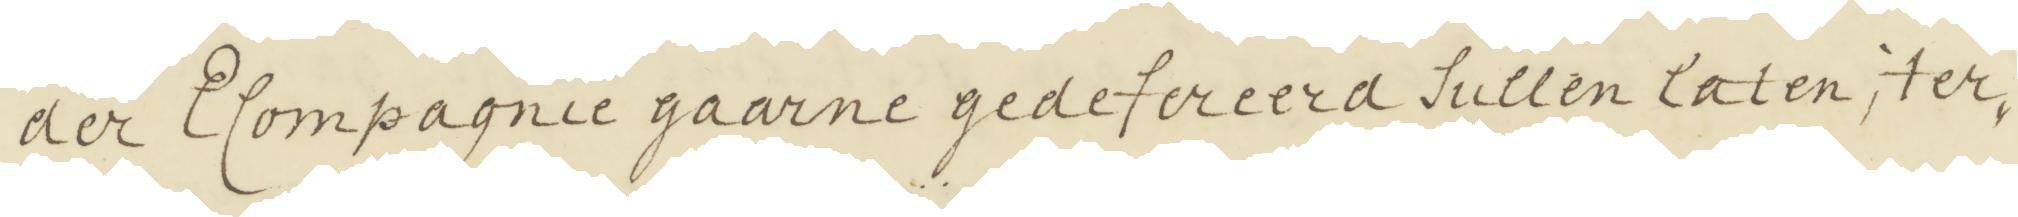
der E Compagnie gaarne gedefereerd sullen laten; ter„
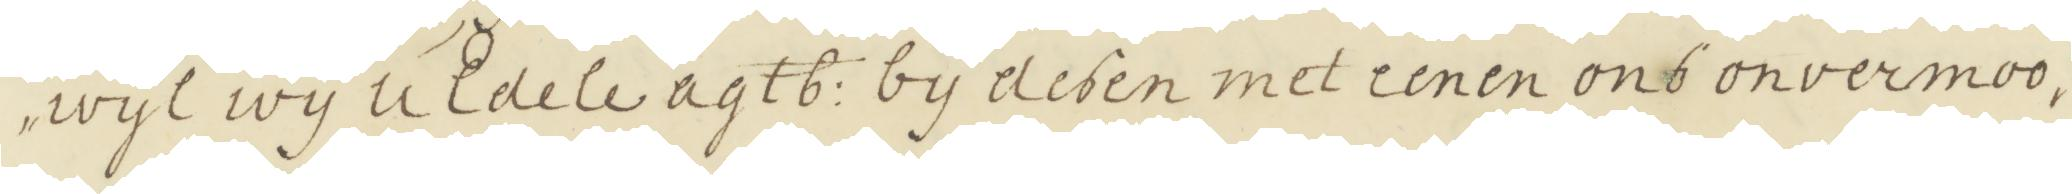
„wijl wij u Edele agtb: bij desen met eenen ons onvermoo„
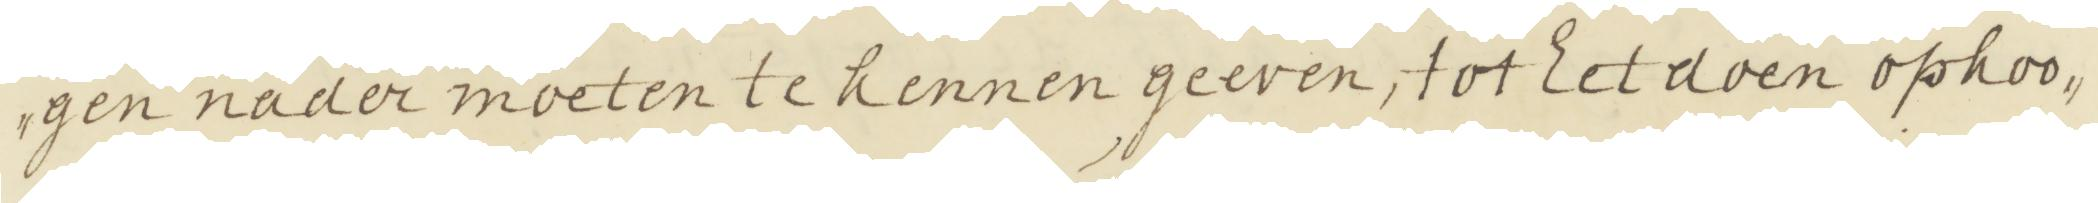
„gen nader moeten te kennen geeven, tot het doen opkoo„
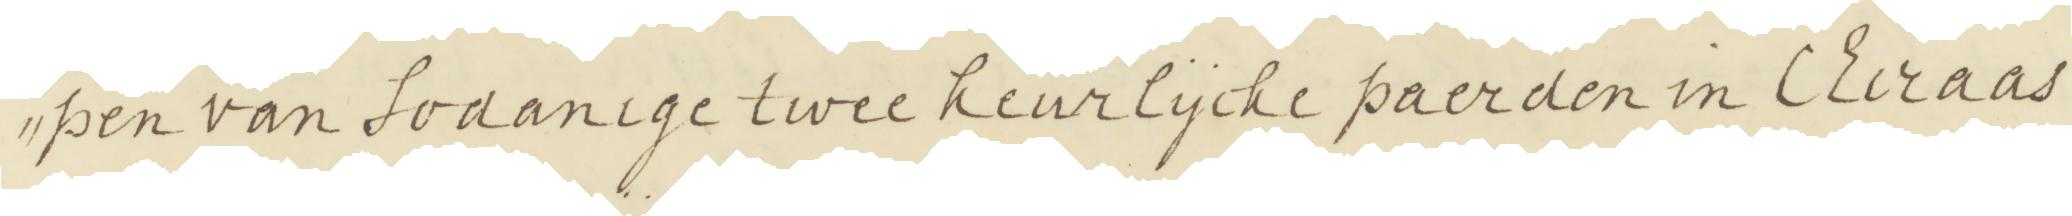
„pen van sodanige twee keurlijcke paerden in Chiraas
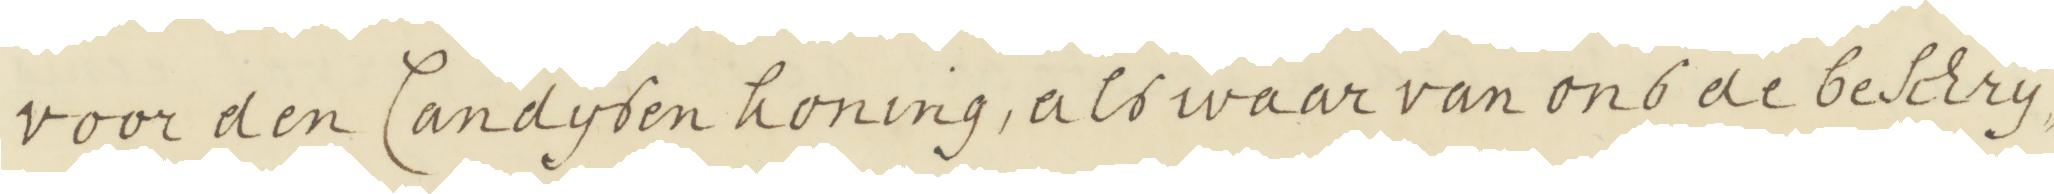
voor den Candijsen koning, als waar van ons de beschrij„
